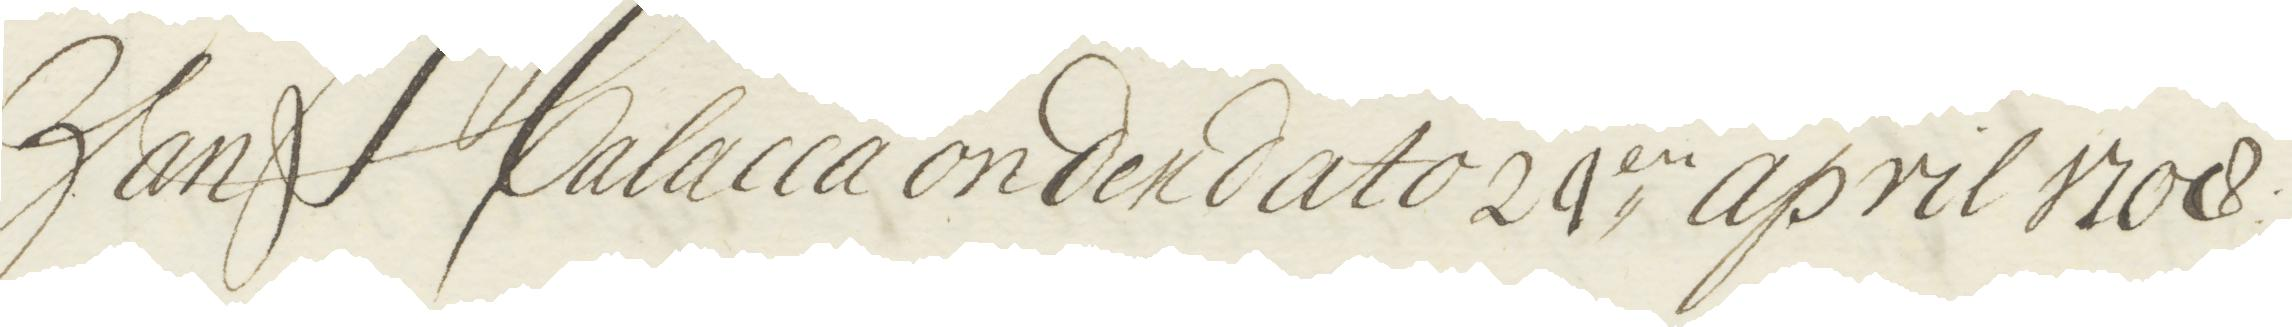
Van Malacca onder dato 24„en april 1708:
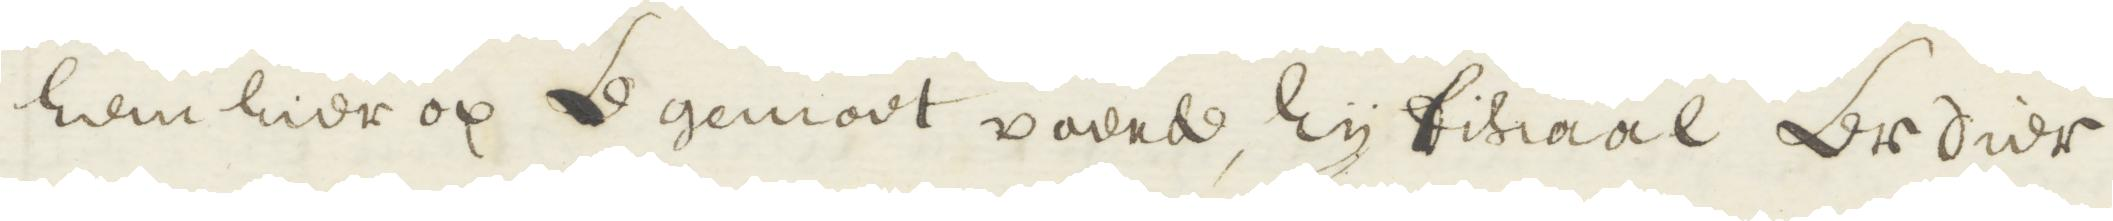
hem hier op te gemoet voerde, hij fiscaal ter dier
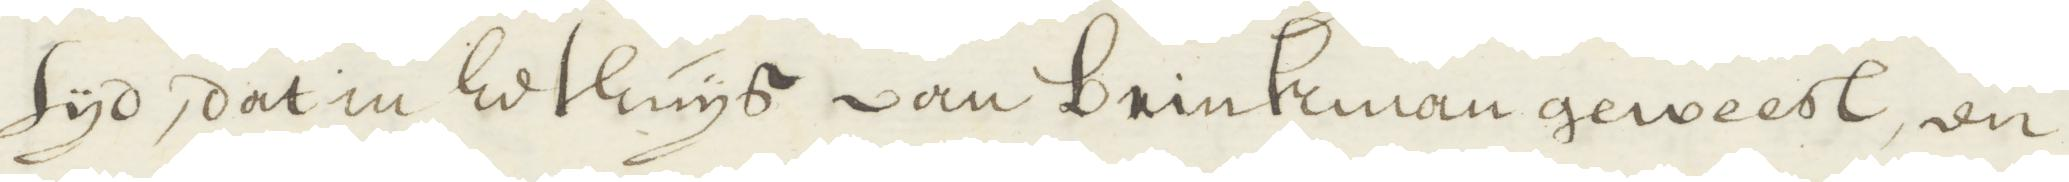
tijd, dat in het huijs van brinkman geweest, en
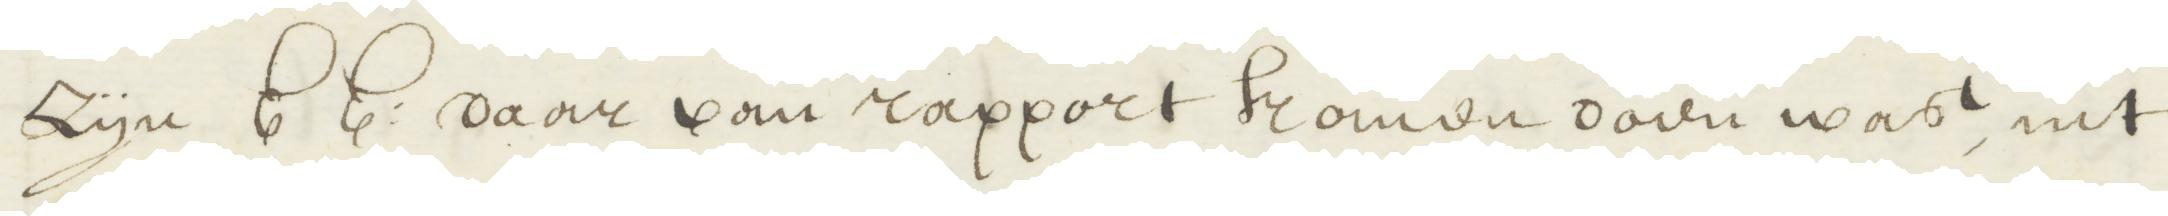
zijn E E: daar van rapport komen doen wast, in ’t
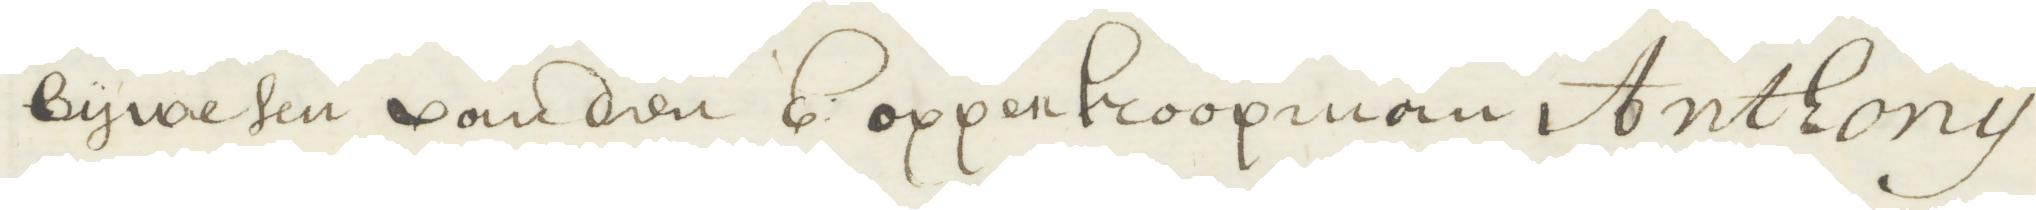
bijwesen van den E.: opperkoopman Anthonij
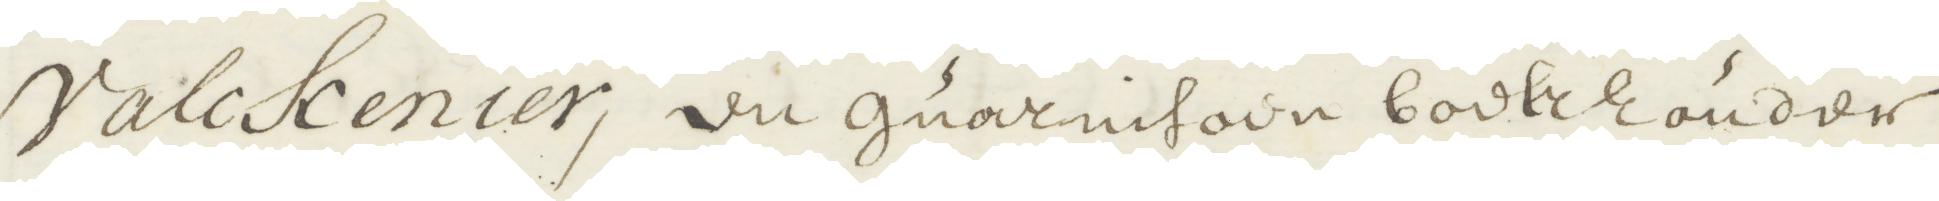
Valckenier, en guarnisoen boekhouder
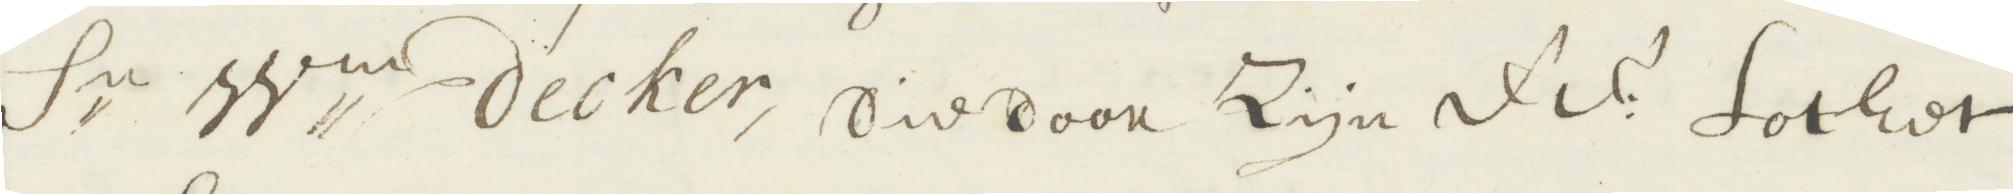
S„n W„m decker, die door zijn E E: tot het
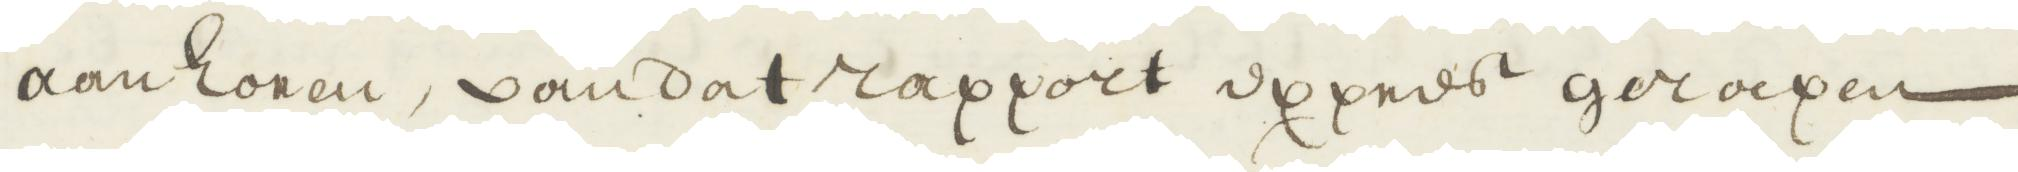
aanhoren, van dat rapport expres geroepen
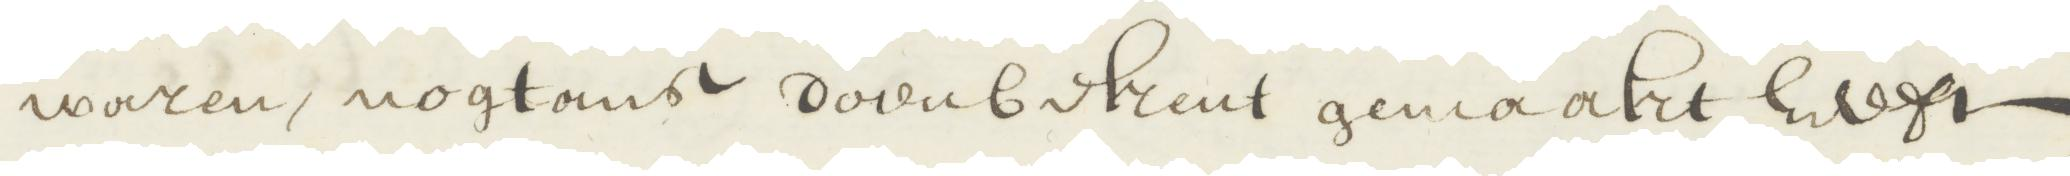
waren, nogtans doen bekent gemaakt heeft
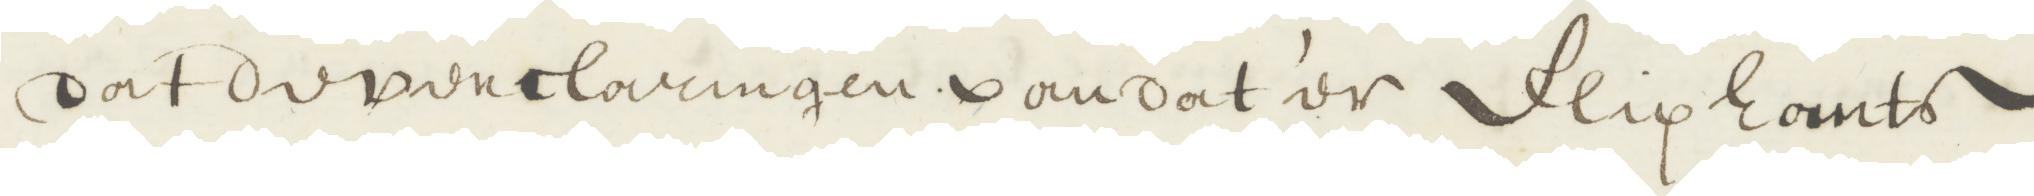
dat de verclaringen van dat 'er Eliphants
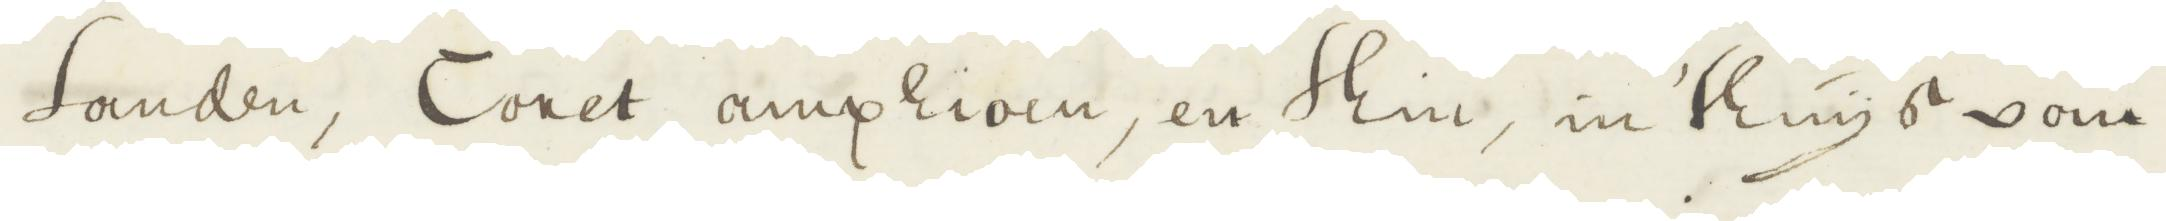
tanden, Coret, amphioen, en thin, in 'thuijs van
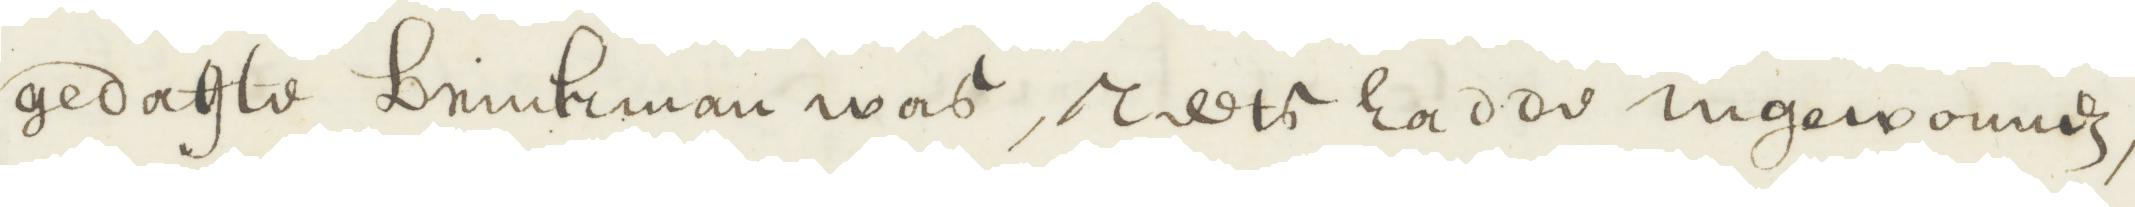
gedagte brinkman was, reets hadde ingewonnen,
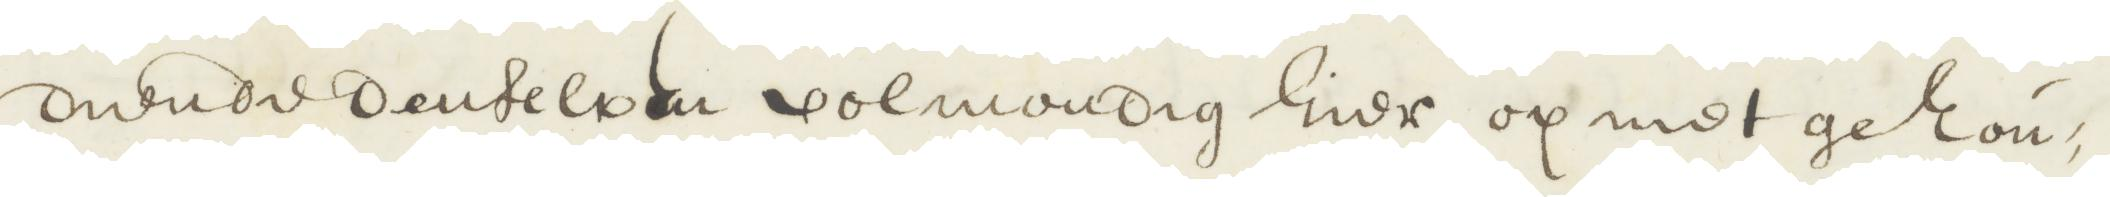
diende denselven volmondig hier op met gehou„
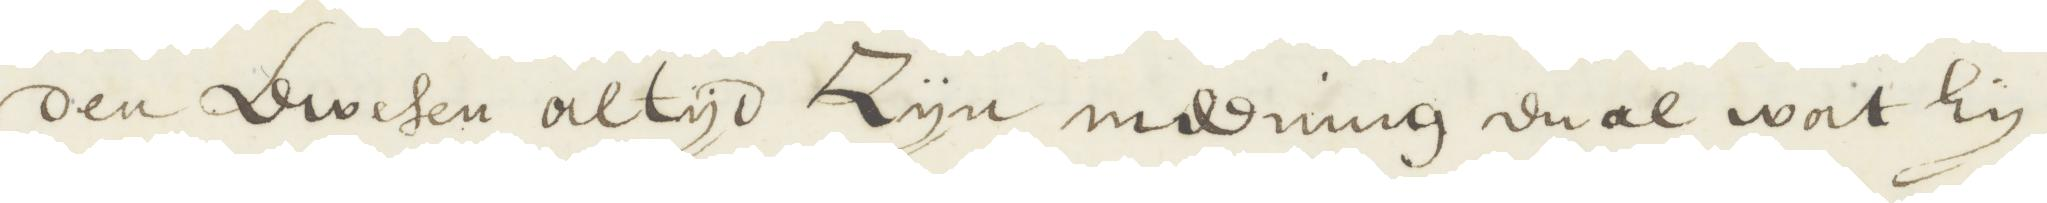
den tewesen altijd zijn meening en al wat hij
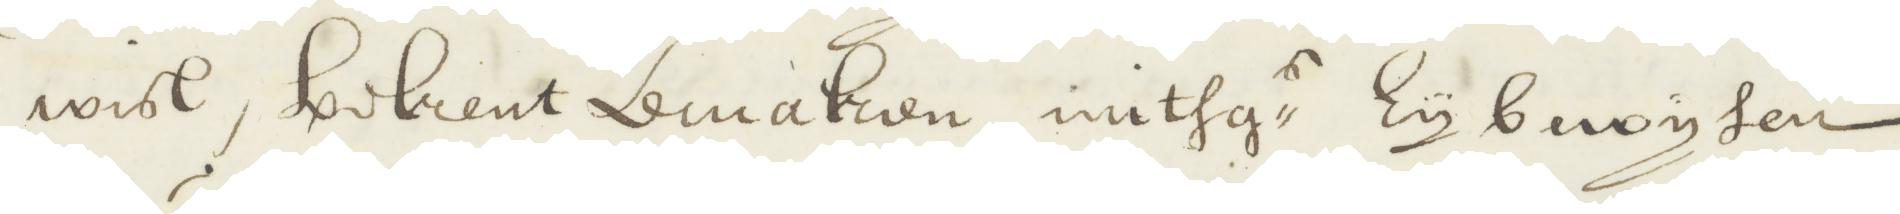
wist, bekent temaken, mitsg„s hij bewijsen
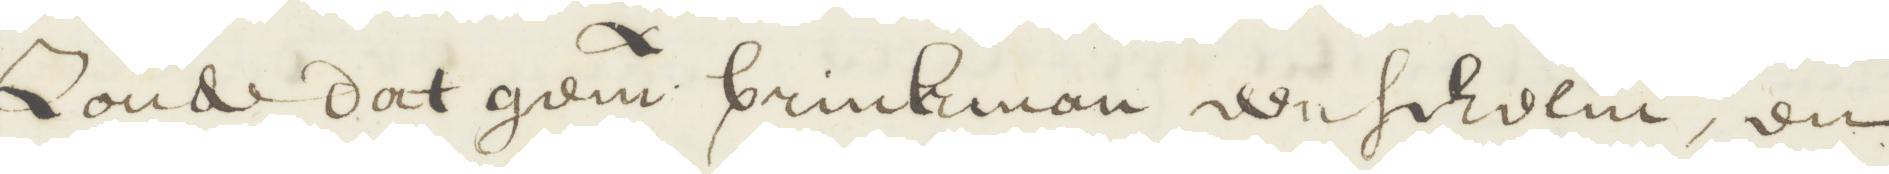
zoude dat gem. brinkman een schelm, en
